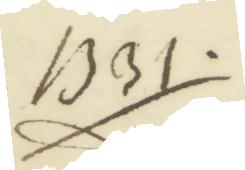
1331.
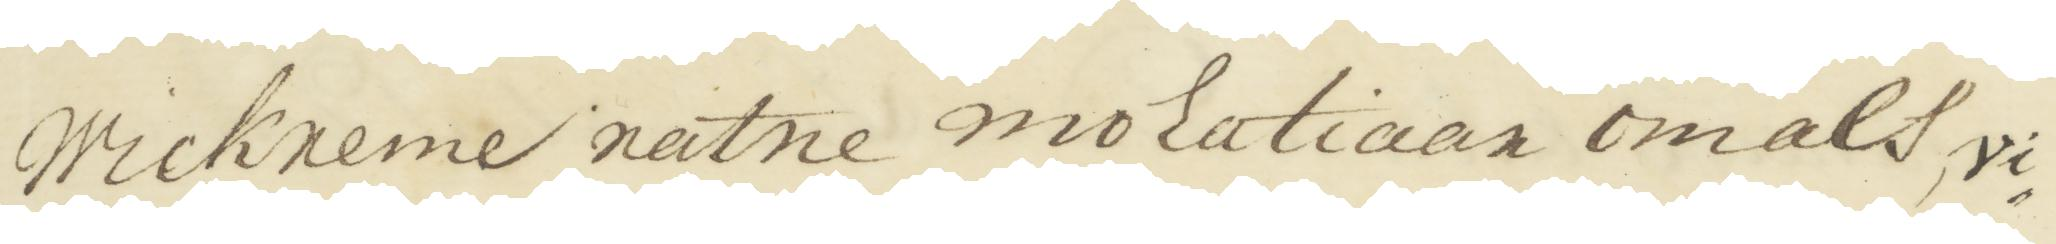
Wickreme vatne mohatiaar om als, vi„
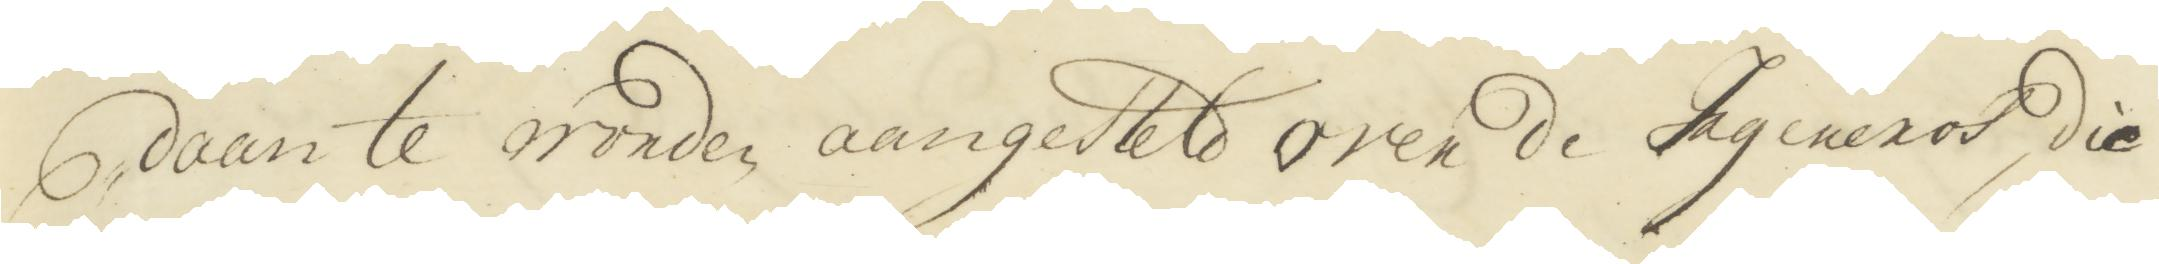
„daan te worden aangesteld over de Iagereros, die
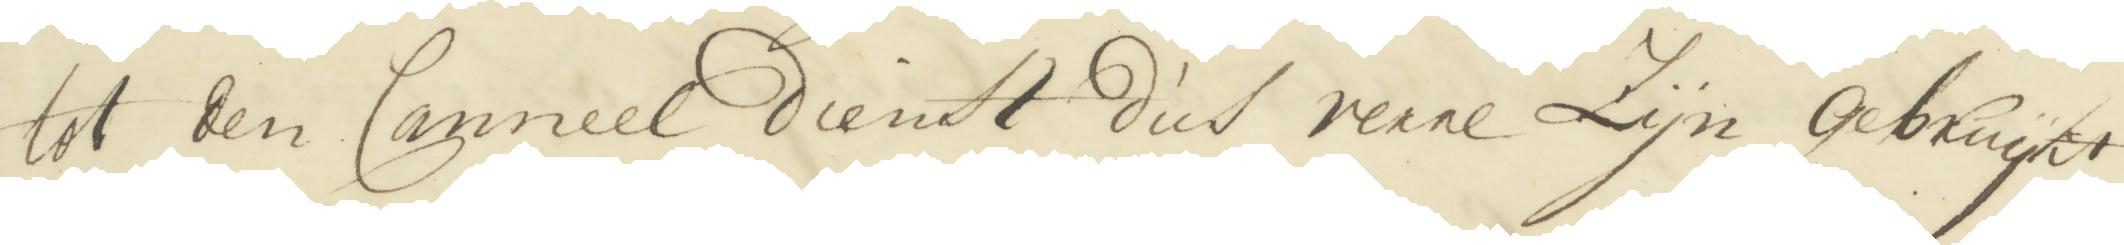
tot den Canneel dienst dus verre zijn gebruijkt
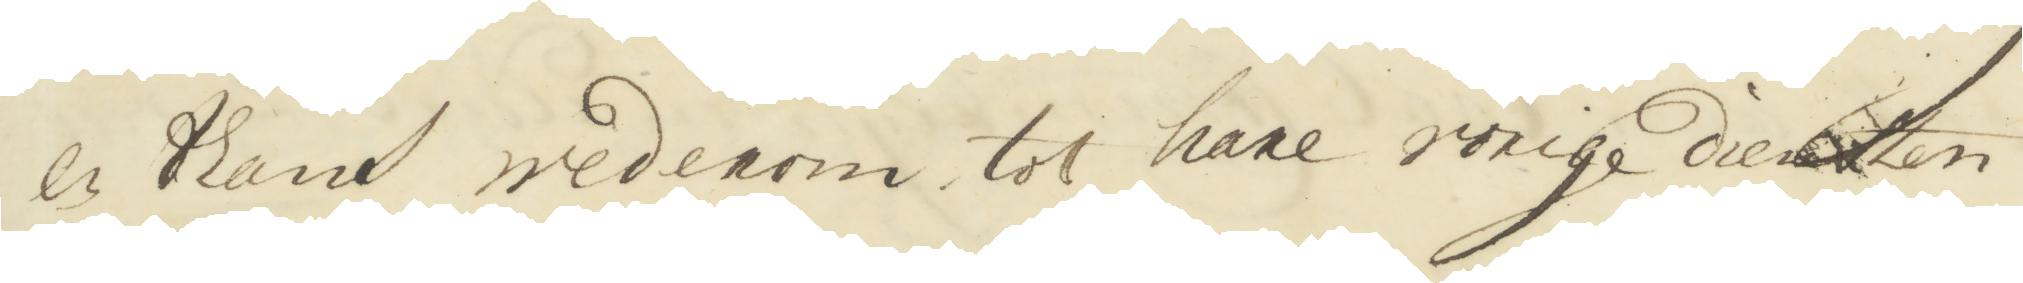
en thans wederom tot hare vorige diensten
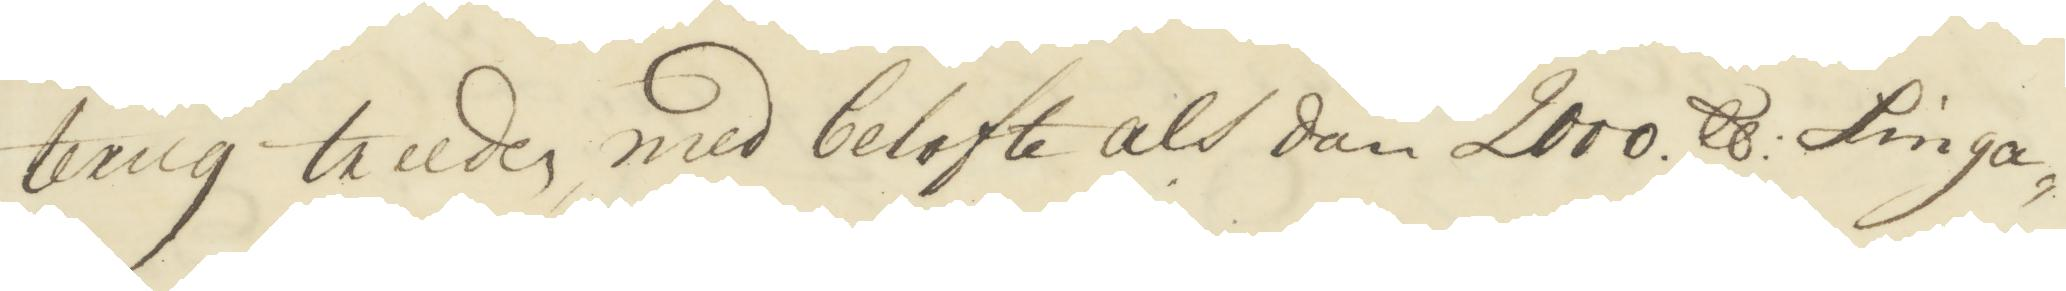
terug treeden, med belofte als dan 2000. lb: Singa„
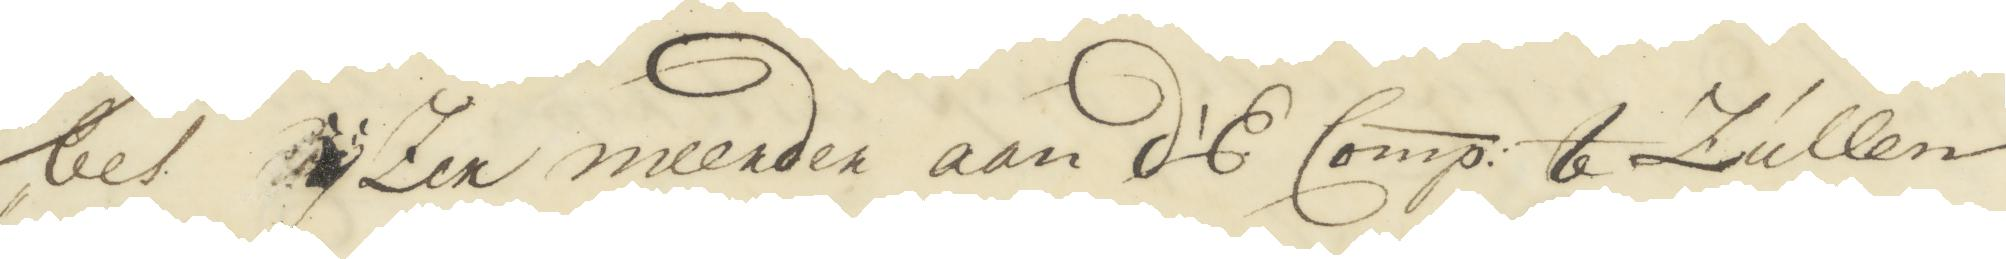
„lees ijzer meerder aan d’E Comp: te zullen
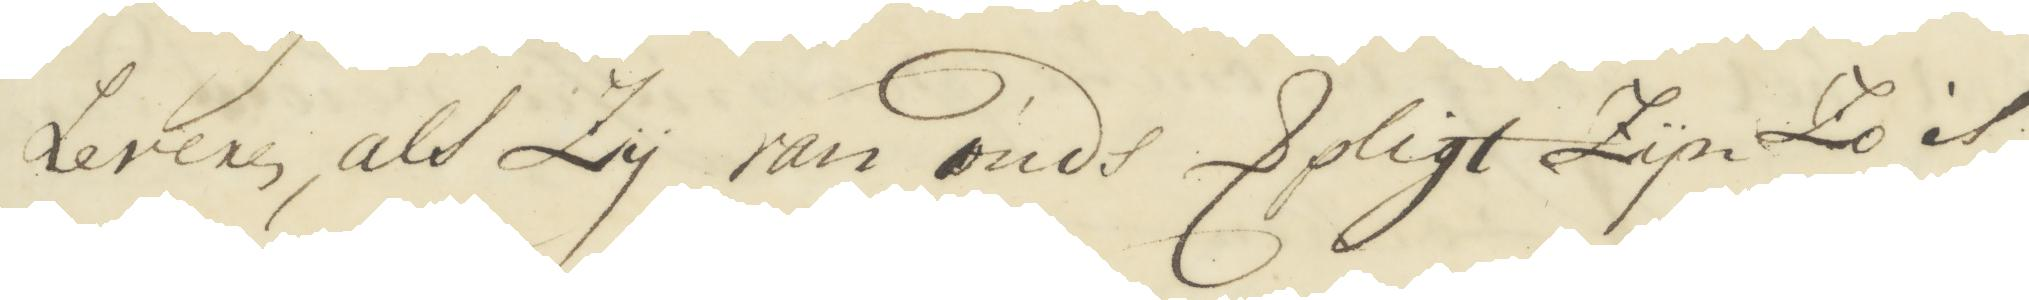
Leveren, als zij van ouds verpligt zijn zo is
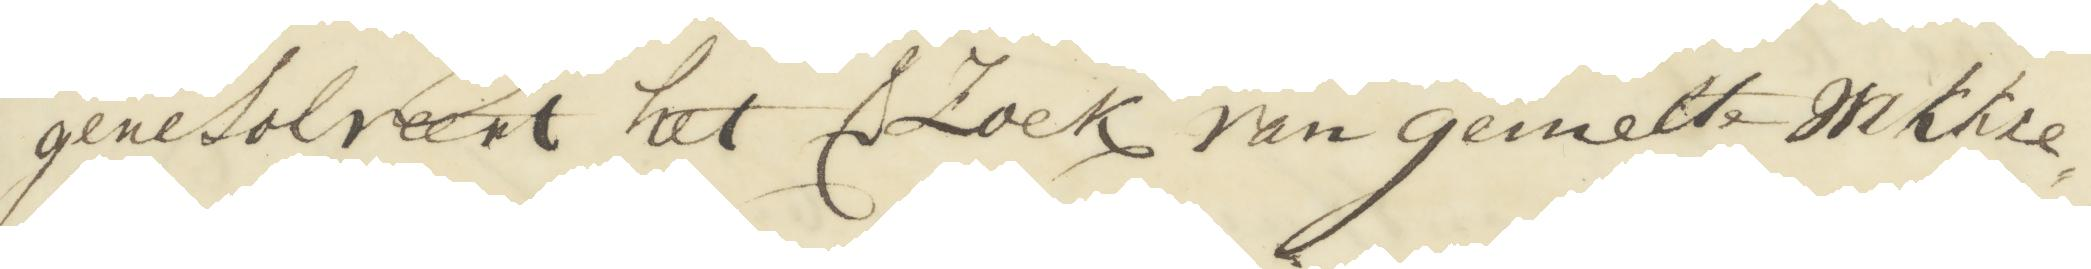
geresolveert het verzoek van gemelte wikkre„
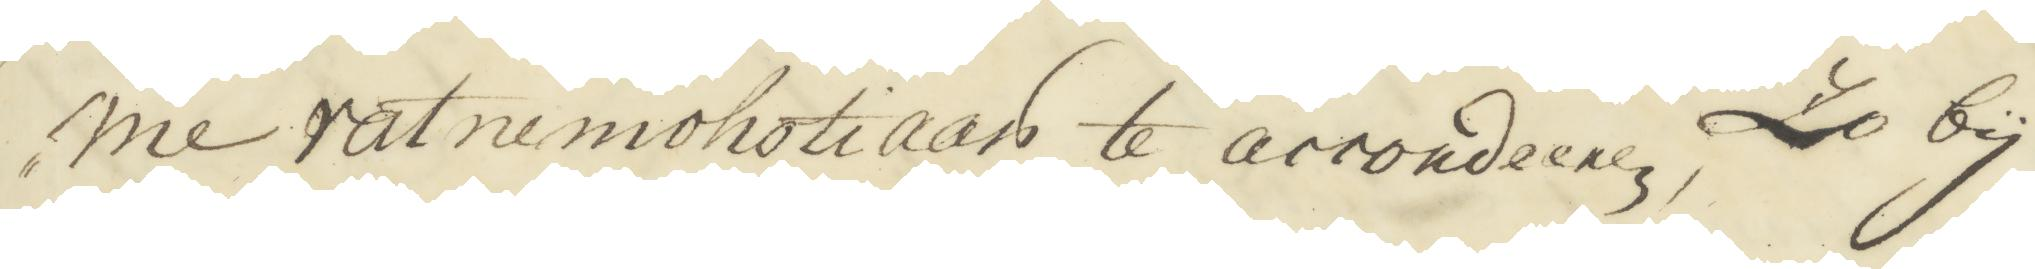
„me vatne mohotiaar te accordeeren, zo bij
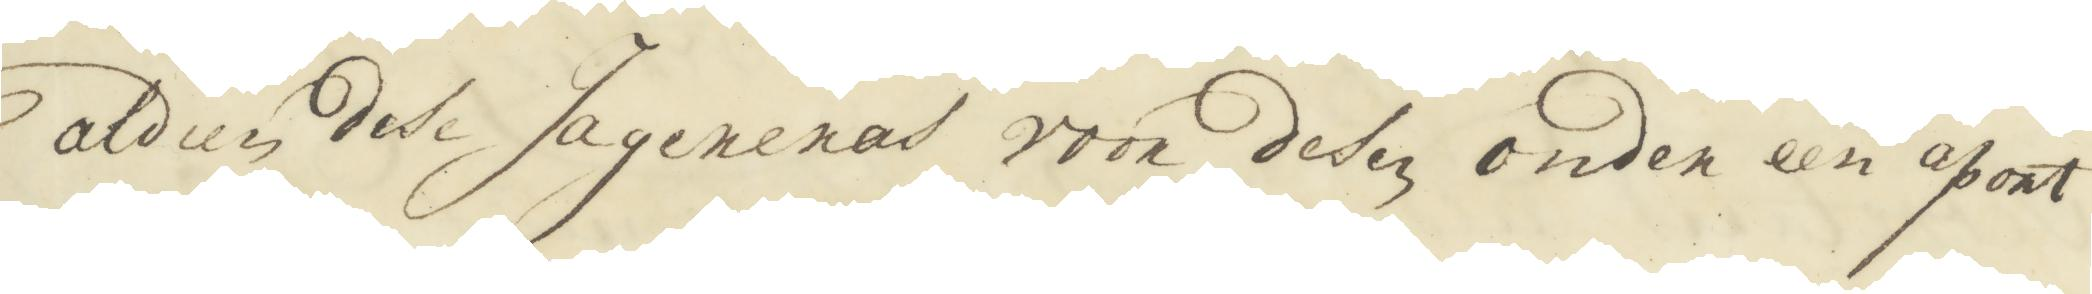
aldien dese Jagereras voor desen onder een apart
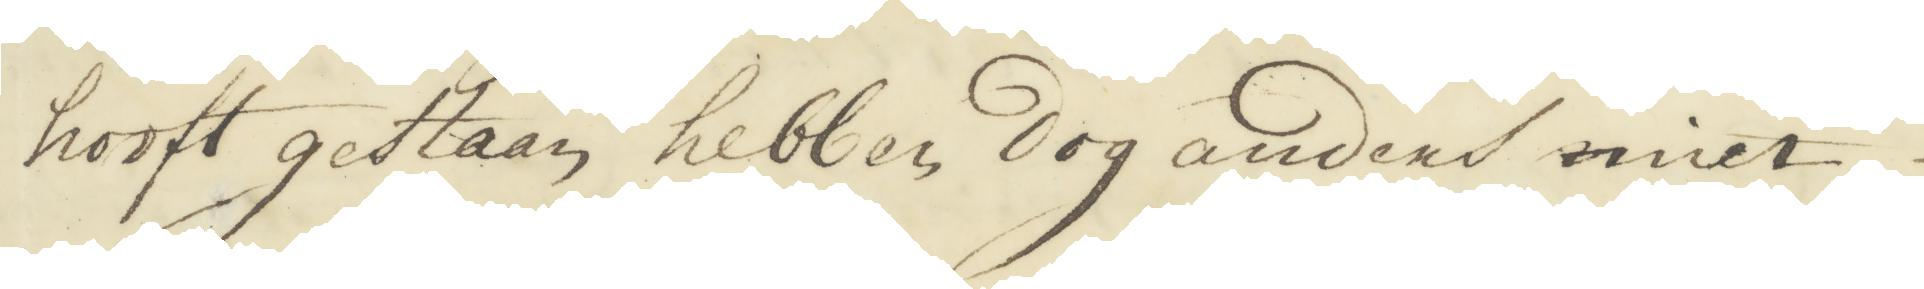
hooft gestaan hebben dog anders niet.
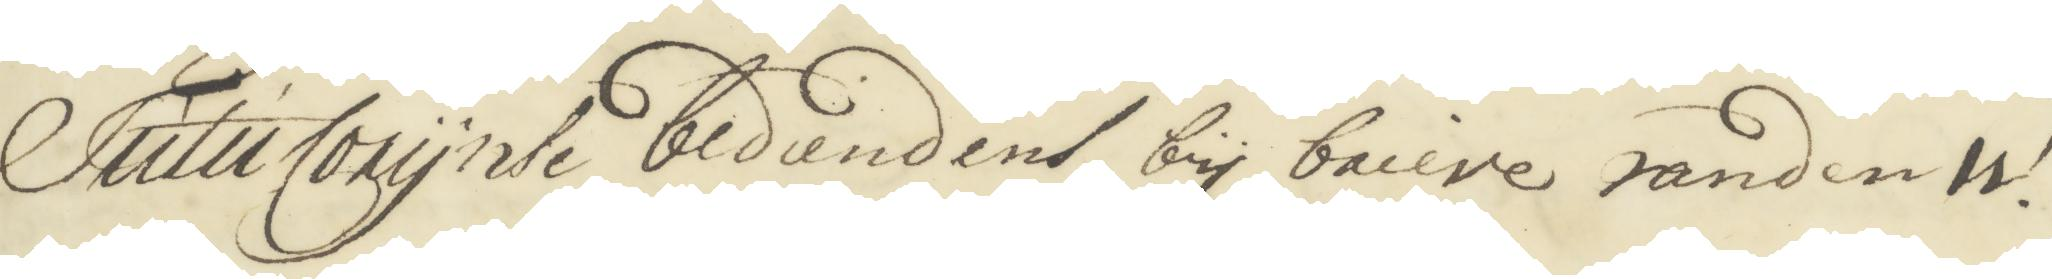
Tutu Corijnse bediendens bij brieve van den 11.
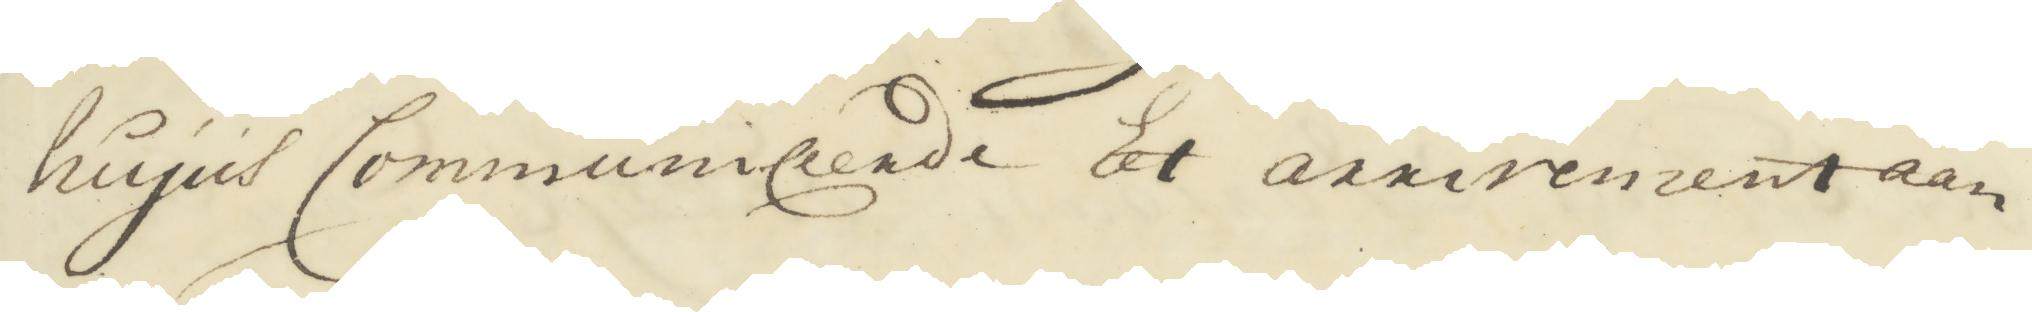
hujus Communiceerde het arrivement aan
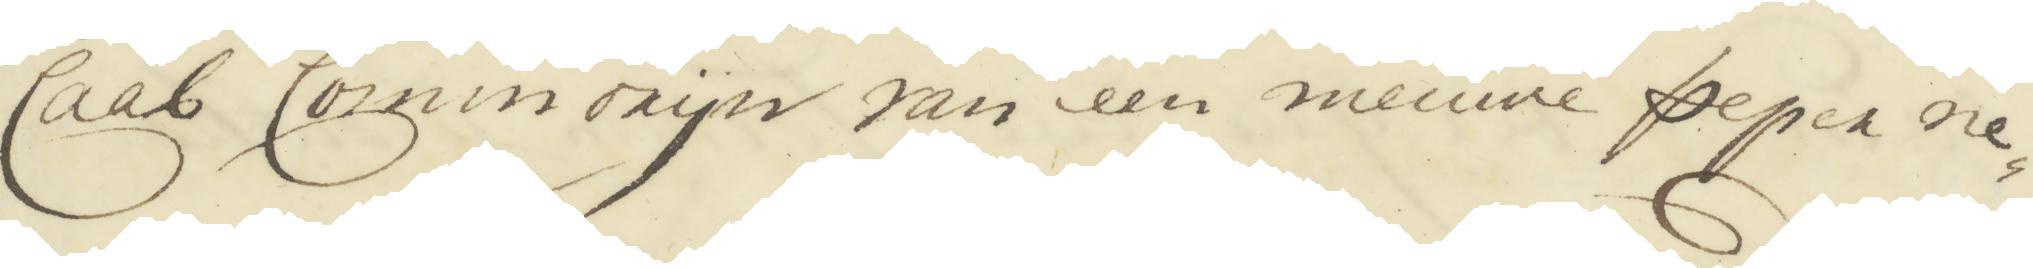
Caab Commorijn van een nieuwe peper ne„
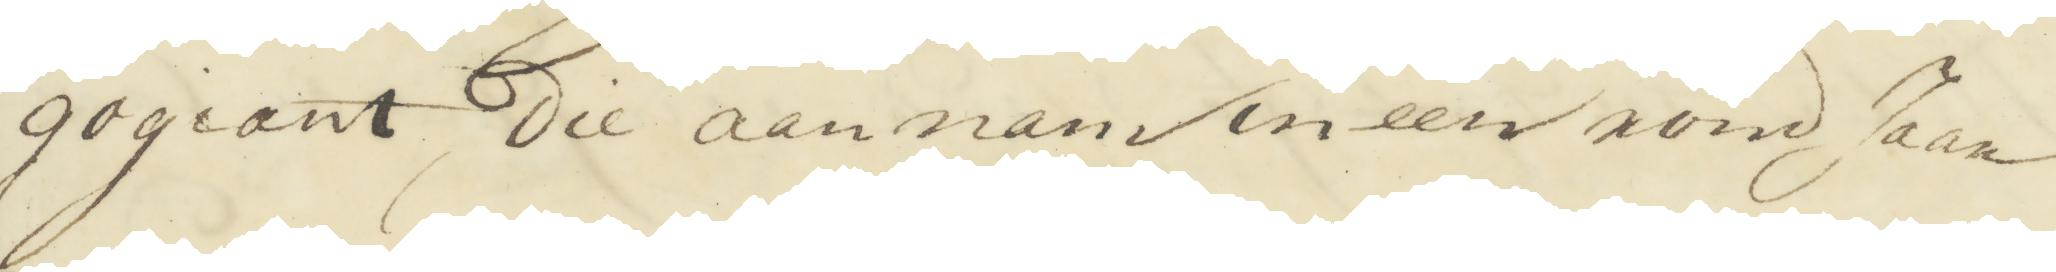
gogiant, die aan nam in een rond Jaar
